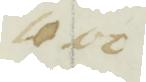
4.00
